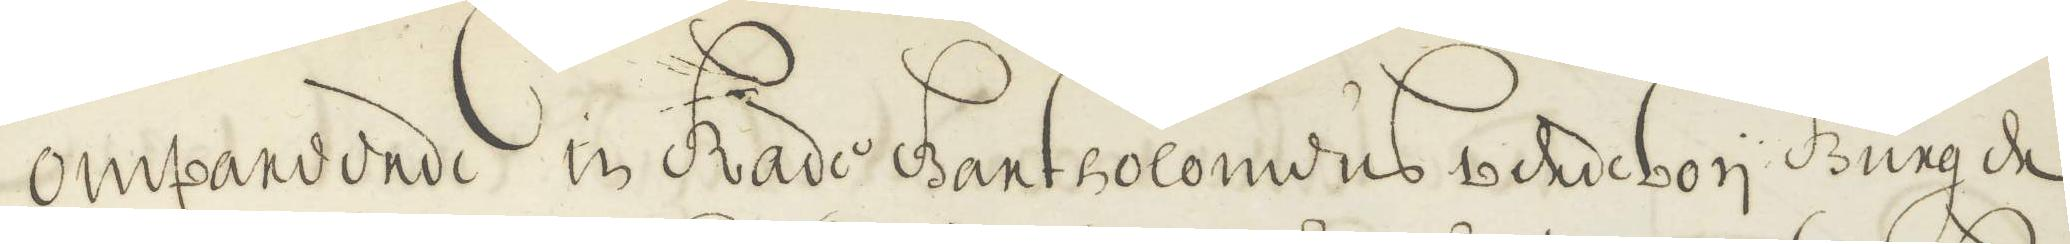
Compareerde in Rade Bartholomeus verdevoij Burger
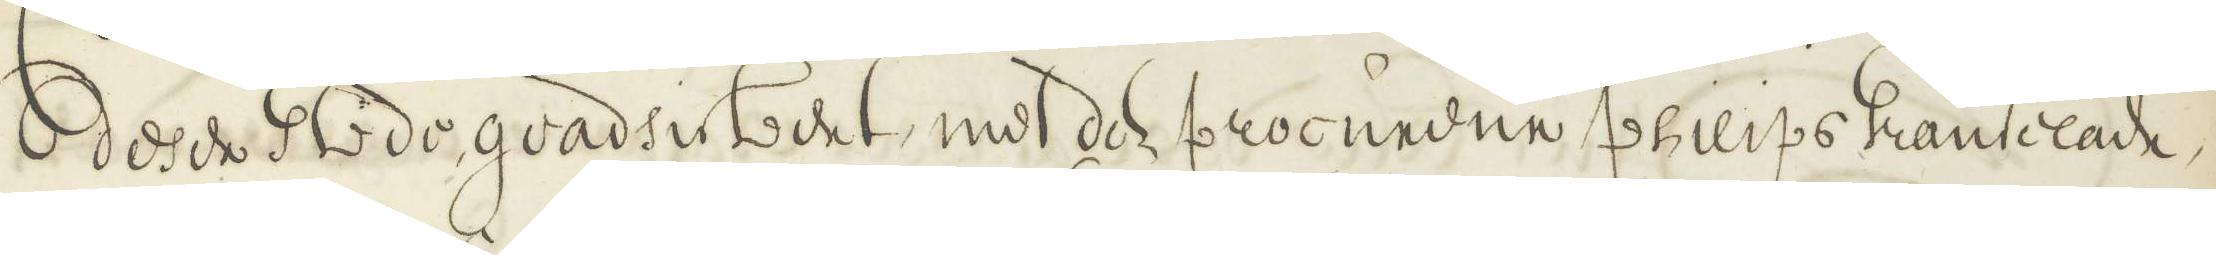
deser stede geadsisteert, met den procureur philips kanselaer,
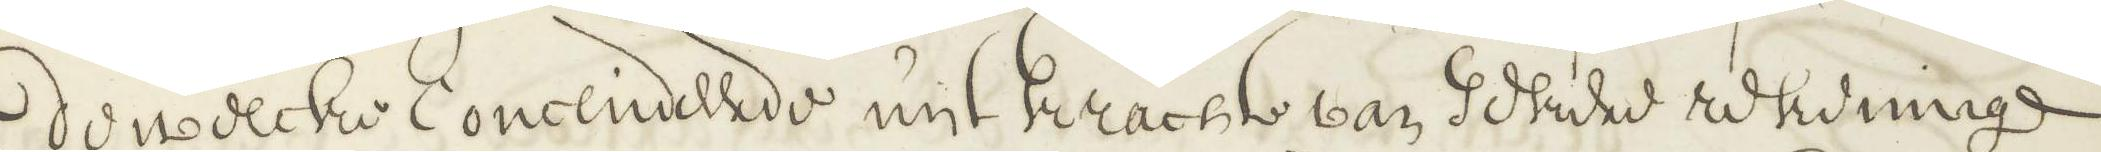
de welcke Concludeerde uijt krachte van sekere rekeninge
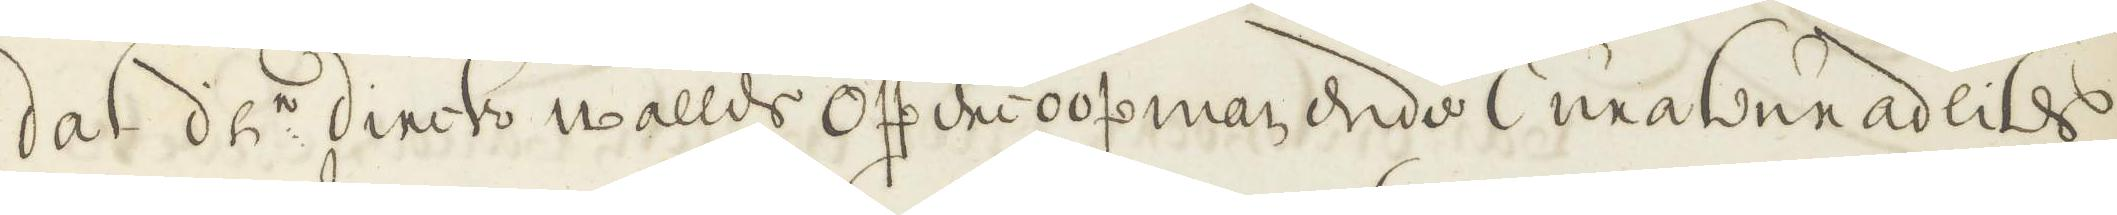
dat d’ h:r dirck walles oppercoopman ende Curateur ad lites
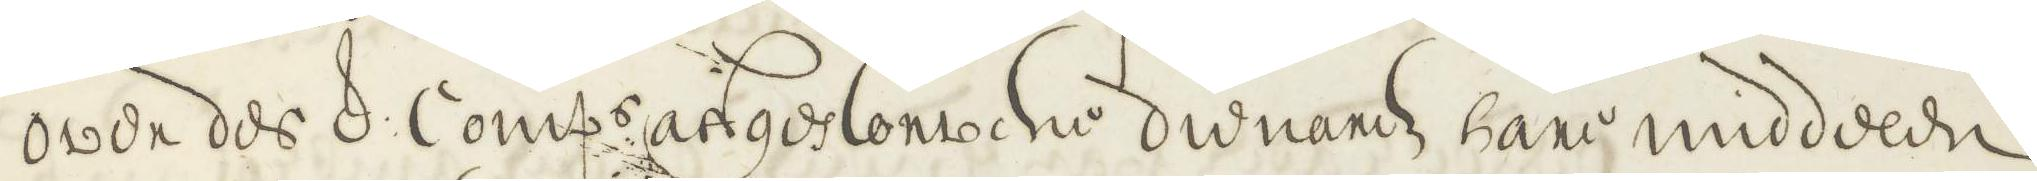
over des E: Comp:s affgestorvene dienaren hare middelen
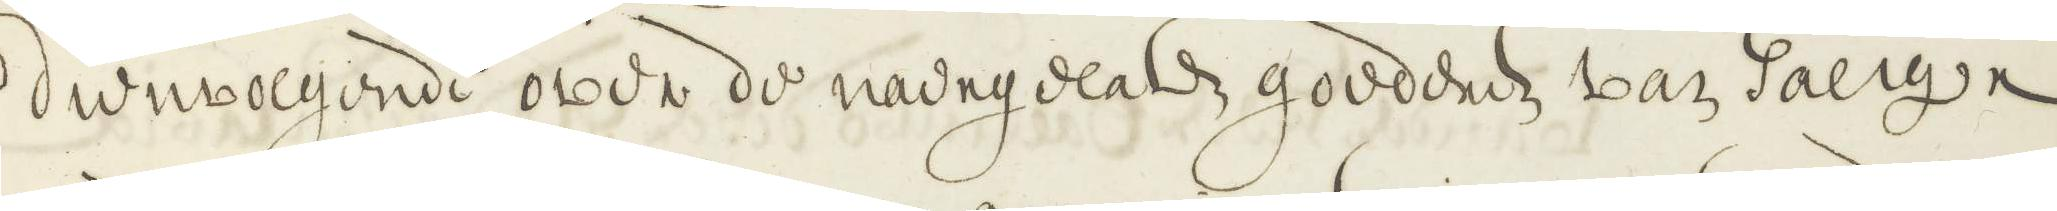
dienvolgende over de naergelaten goederen van saliger
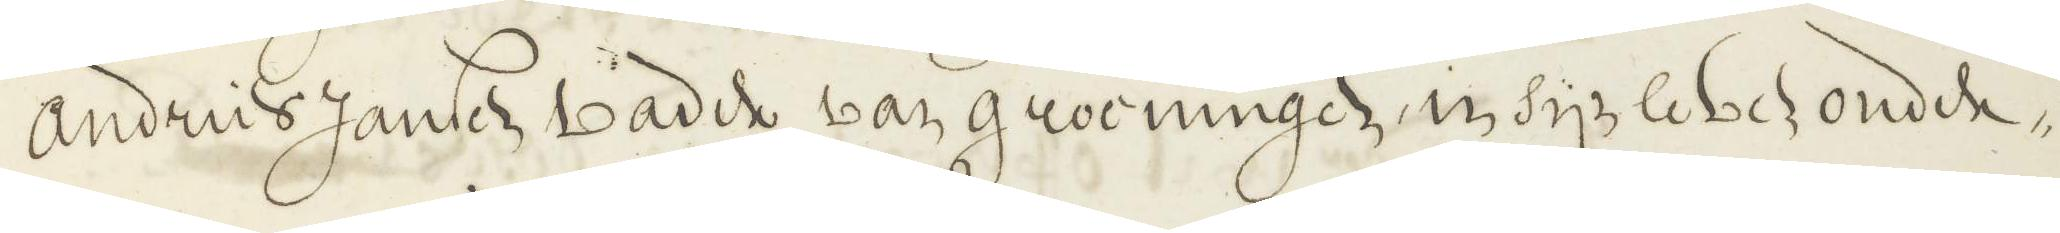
andries Jansen vader van groeningen, in sijn leven onder„
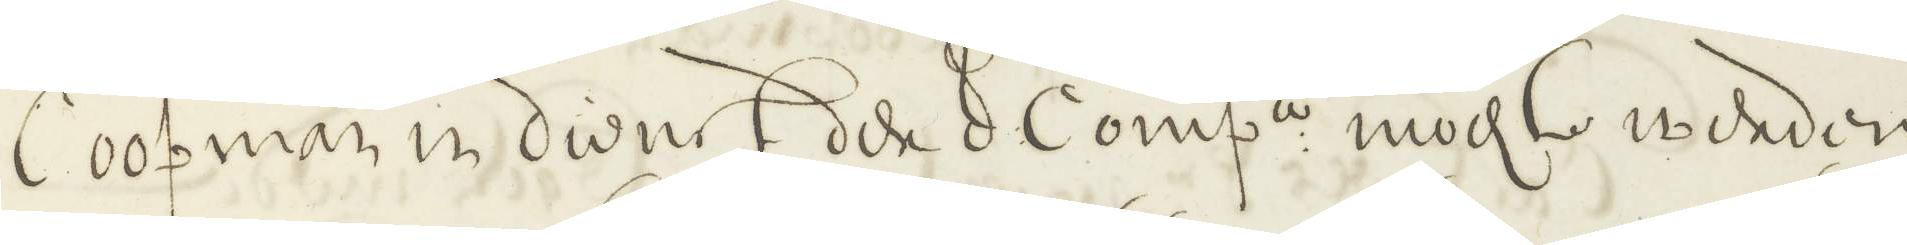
Coopman in dienst der E: Comp:e mochte werden
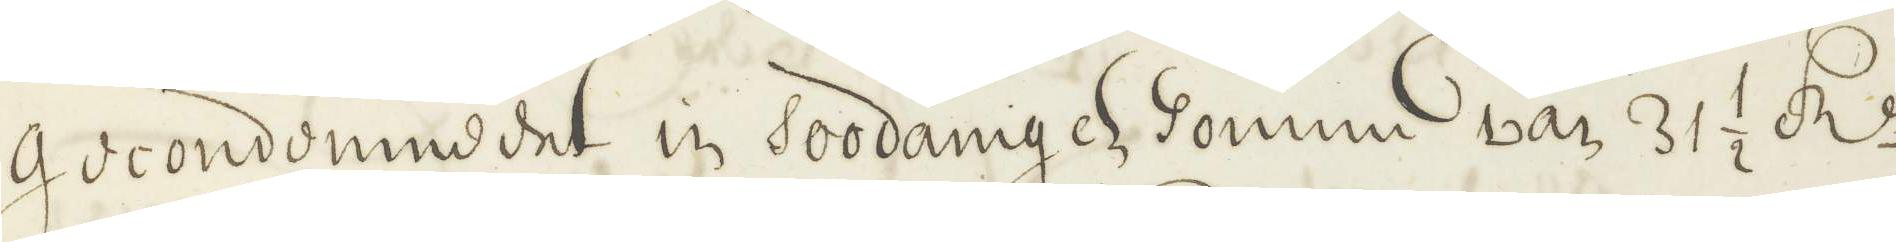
gecondemneert in soodanigen somme van 31½ R=a
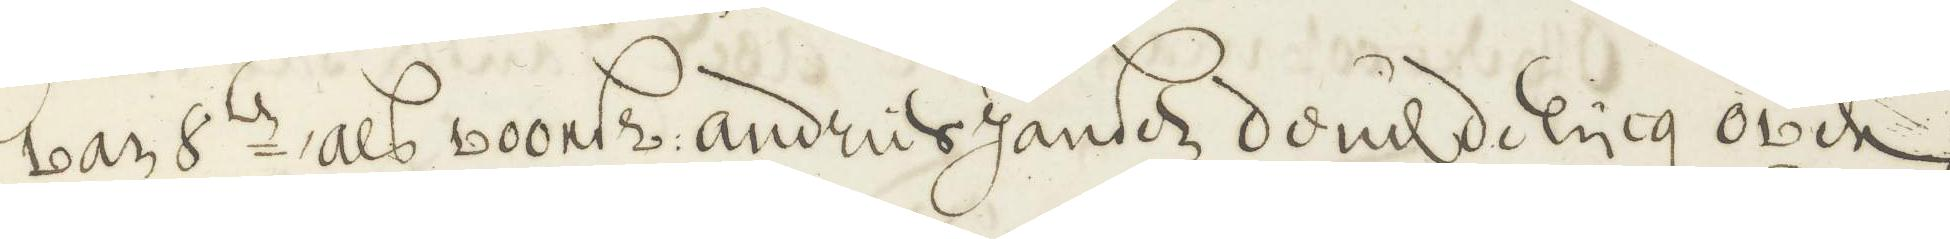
van 8=ten, als voorsz: andries Jansen deuchdelijcq over
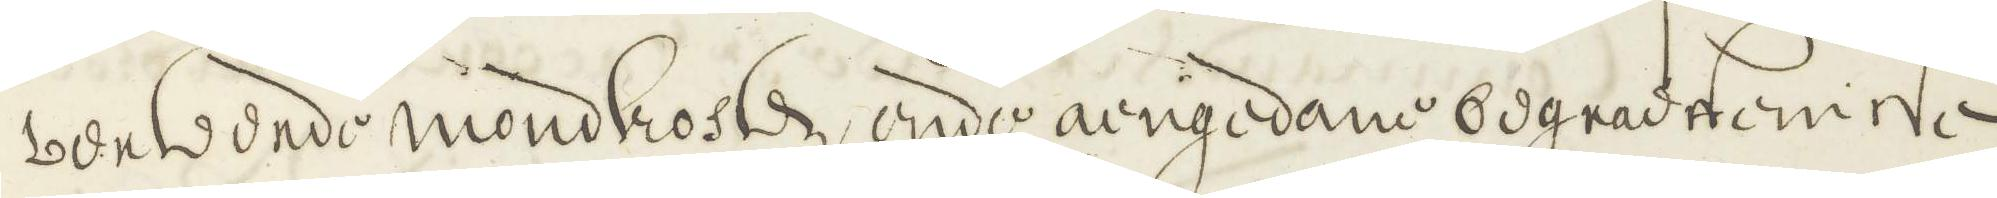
verteerde mondkosten, ende aengedane begraeffenisse
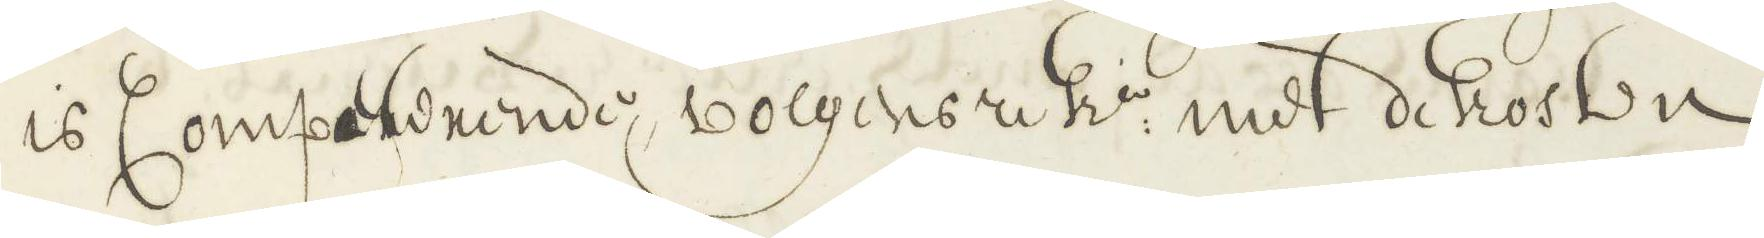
is Competerende volgens rek:e met de kosten
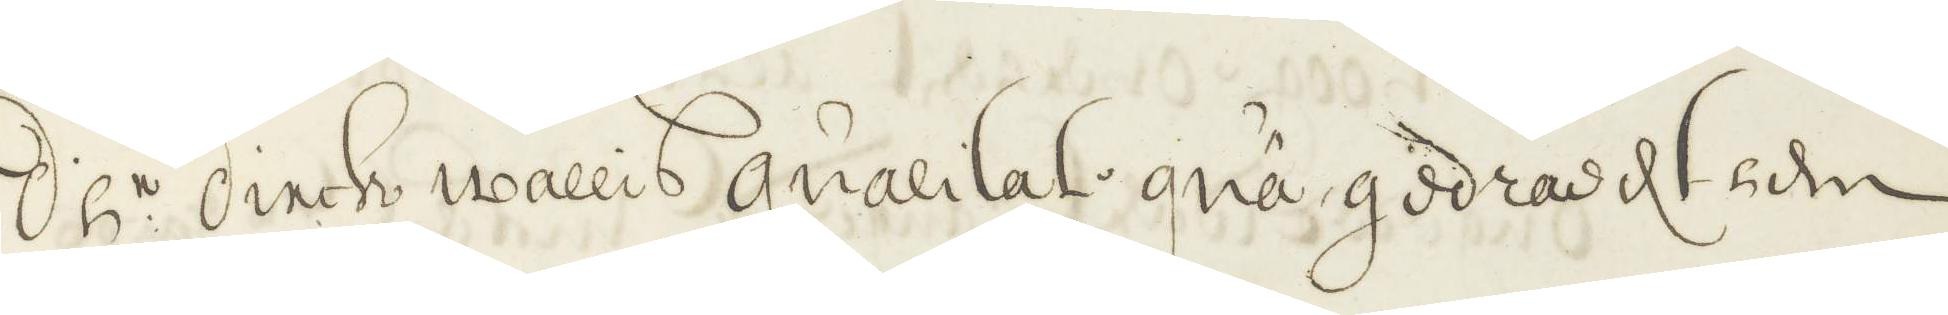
d’h:r dirck wallis qualitate quâ, gedraect hem
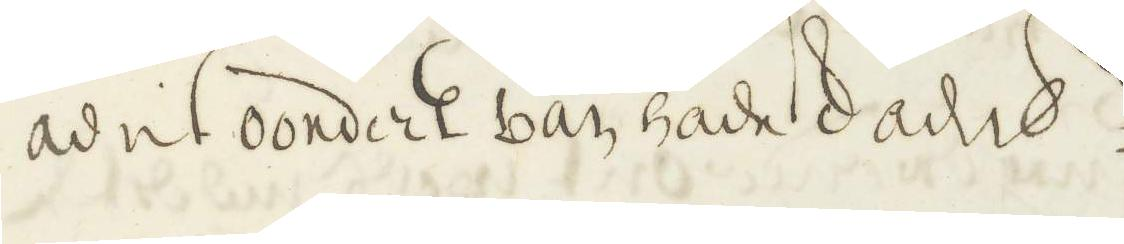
aent oordeel van haer E achtb=
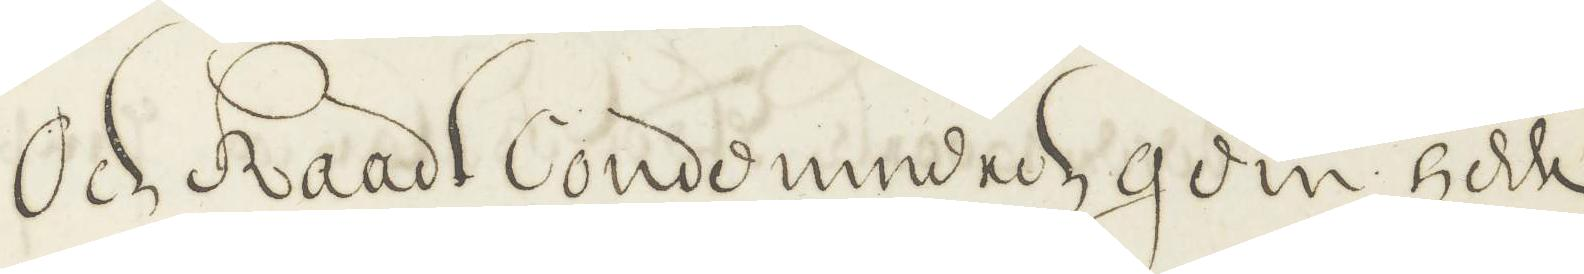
Den Raadt Condemneren gem: heer
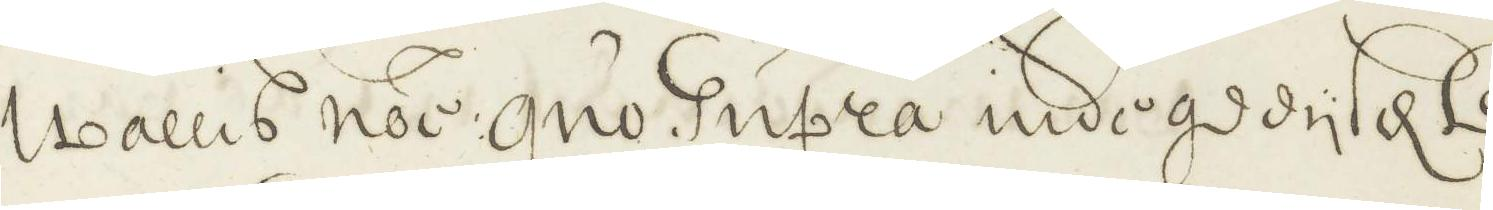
wallis noc: quo supra inde geeijschte
